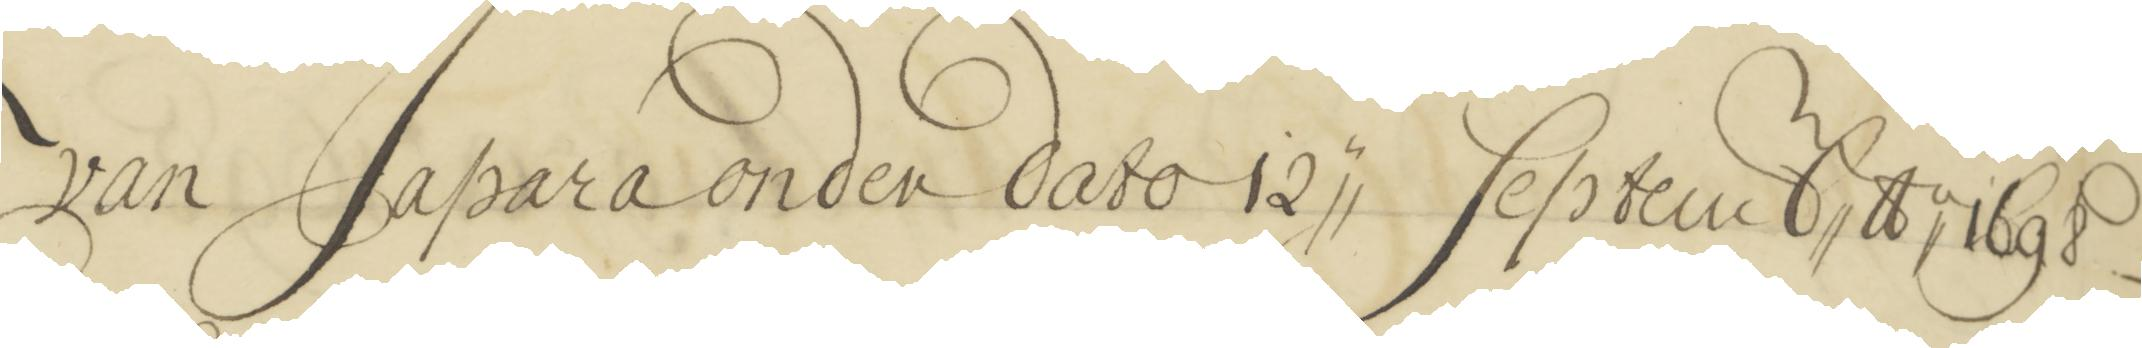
Van Japara onder dato 12„n Septemb„ A„o 1698.
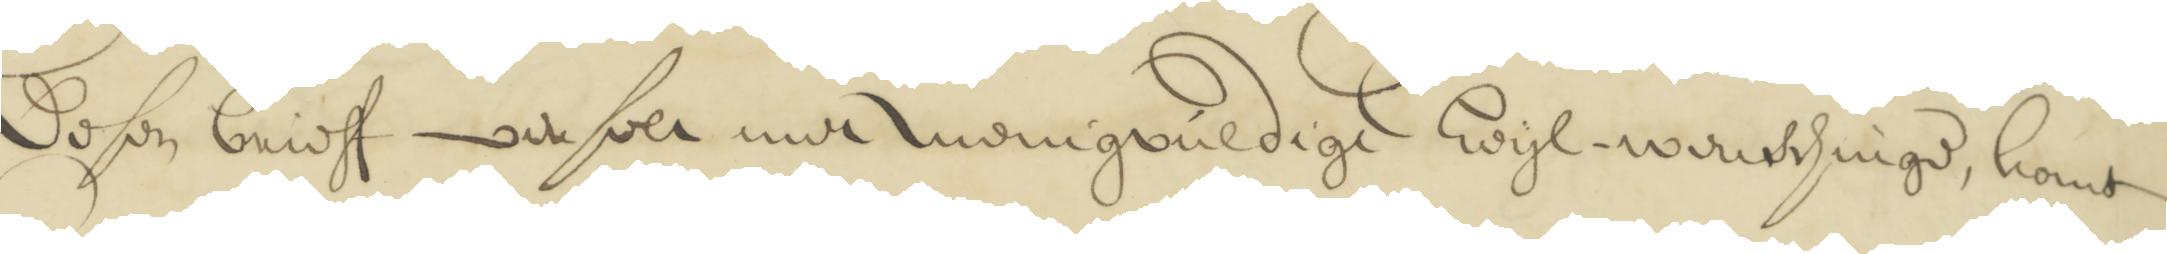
Desen brieff verselt met menigvuldige heijl-wenschinge, komt
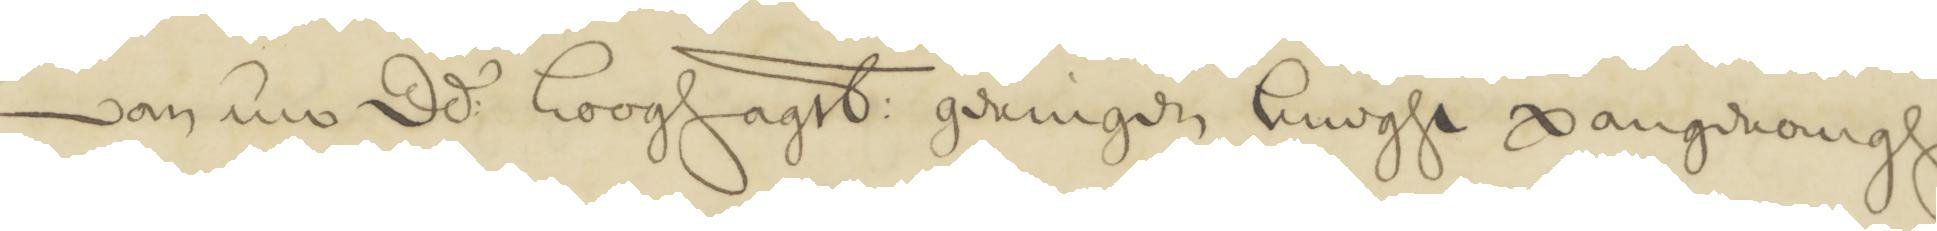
van uw Ed:' hoogh agtb: geringen kneght pangerangh
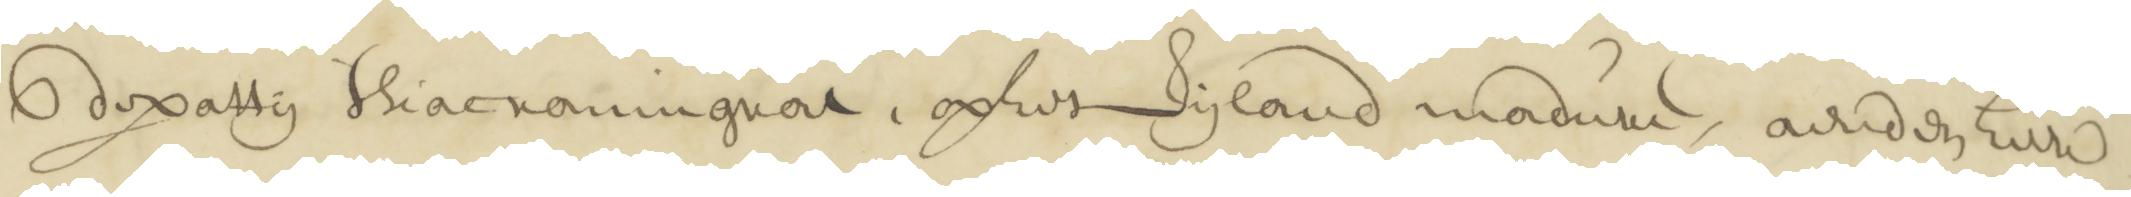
depattij thiacraningrat, op het Eijland madure, aen den heer
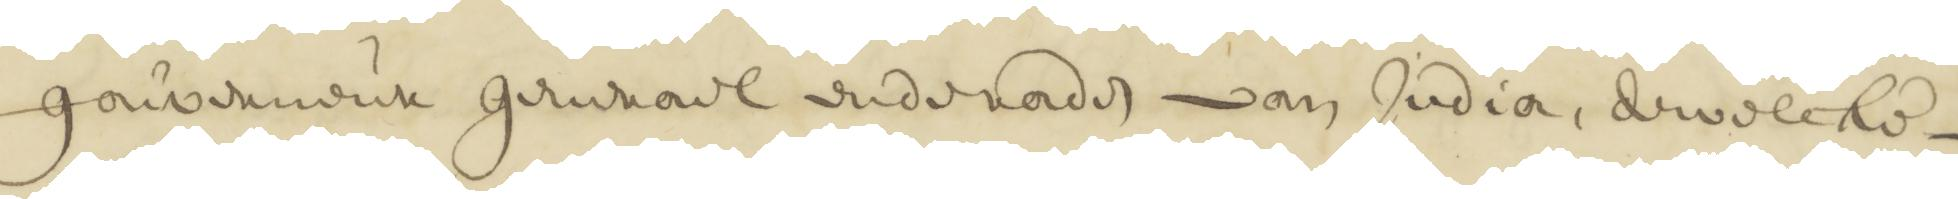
gouverneur generael ende raden van India, dewelcke
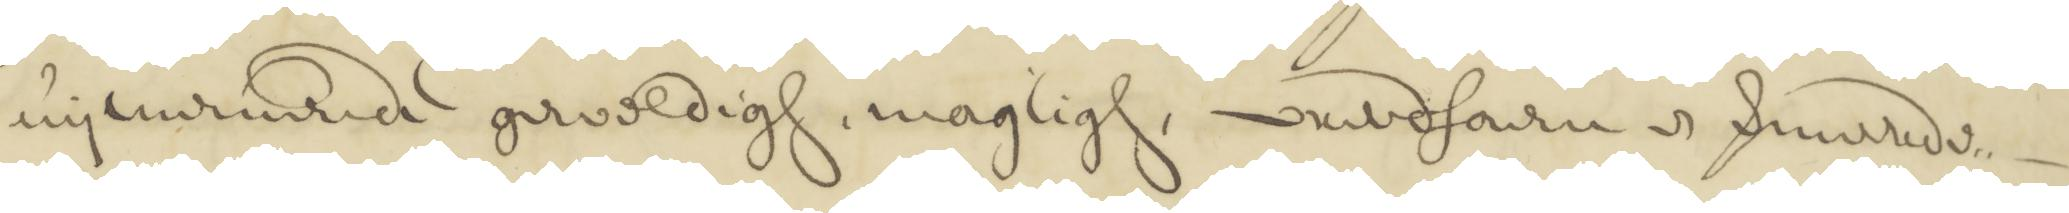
uijtnemende geweldigh, magtigh, vreedsaem en vermeerde„
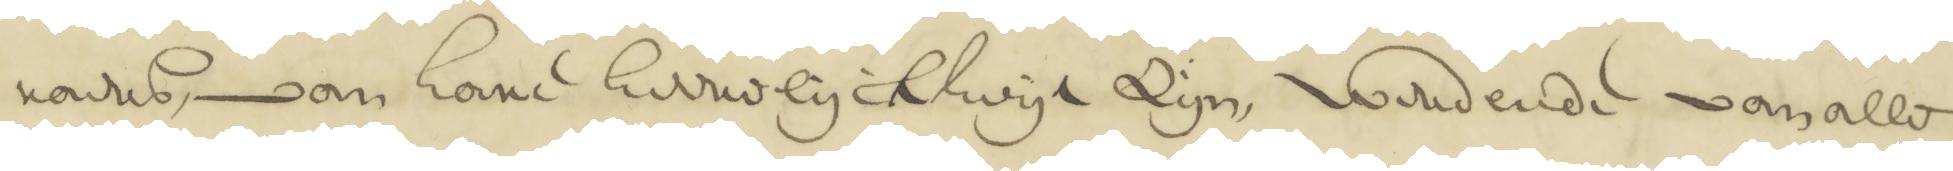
raers, van hare heerelijckheijt zijn, werdende van alle
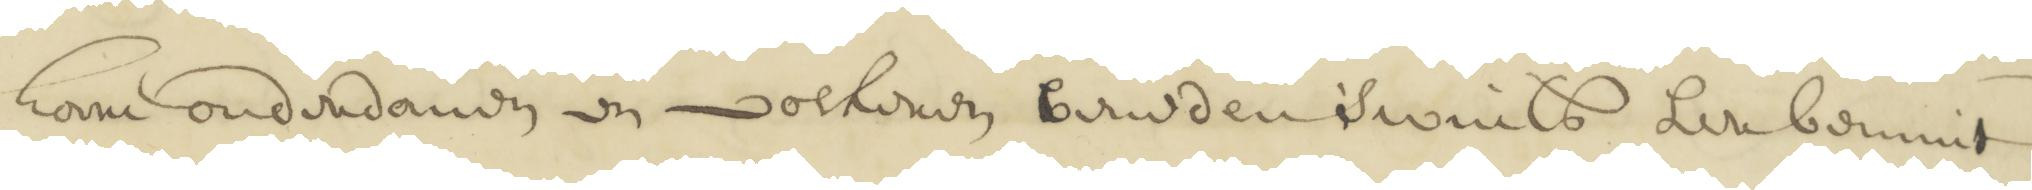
hare onderdanen en volkeren beneden 'swints seer bemint
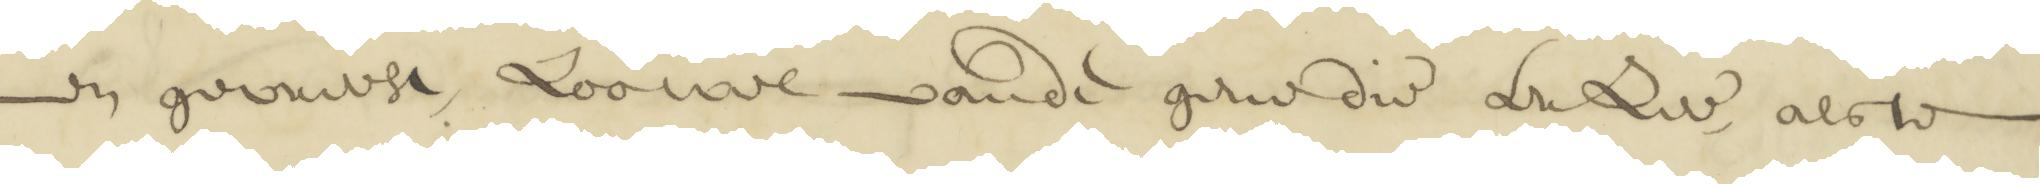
en gevreest, zoo wel vande gene die ter zee, als te
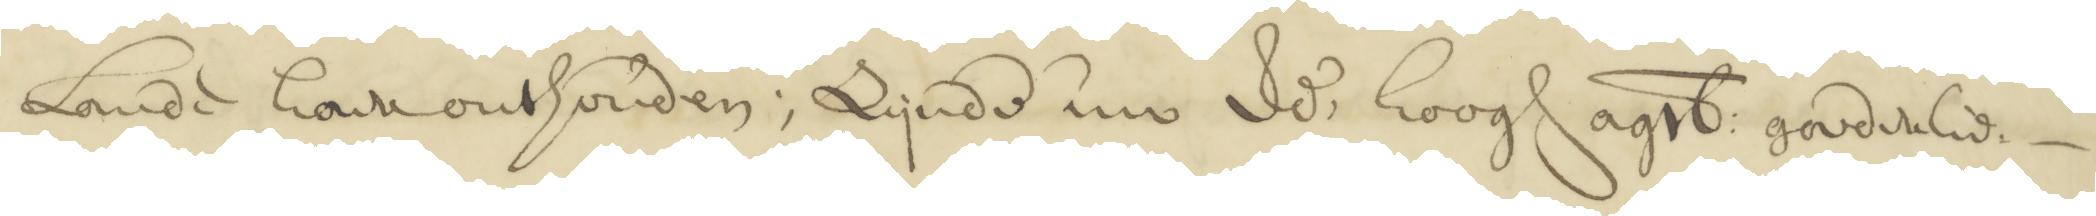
lande haer onthouden; zijnde uw Ed:' hoogh agtb: goedertie. —
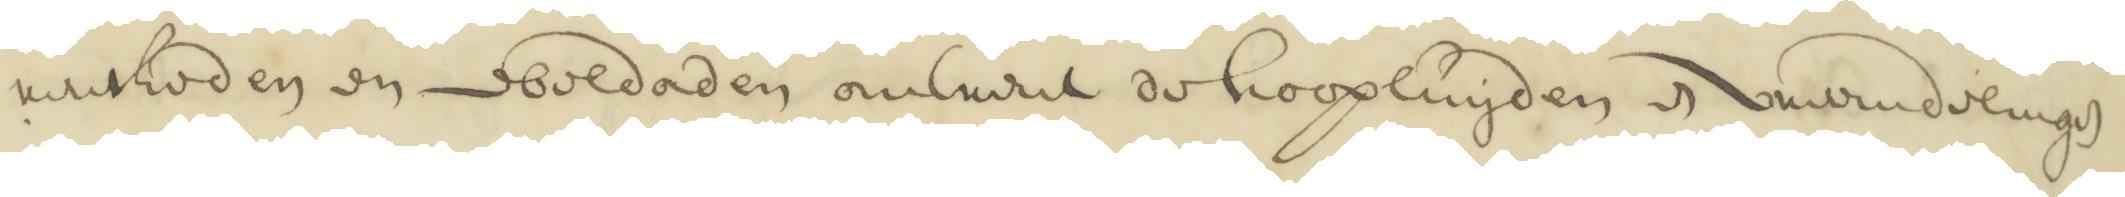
rentheden en weldaden omtrent de koopluijden en vreemdelingen
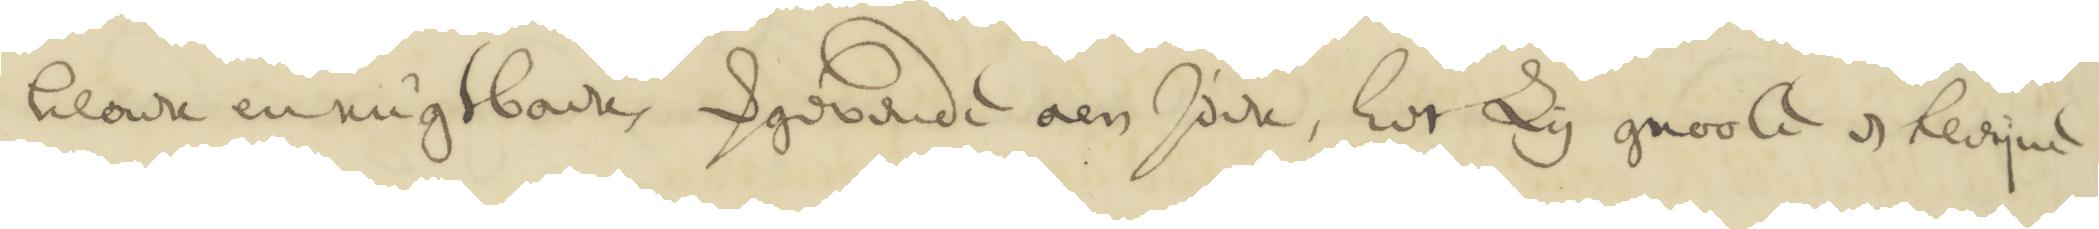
klaer en rugtbaer, vergevende aen Jder, het zij groote en kleijne
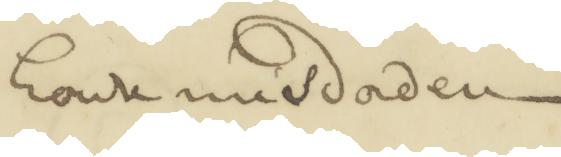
haer misdaden
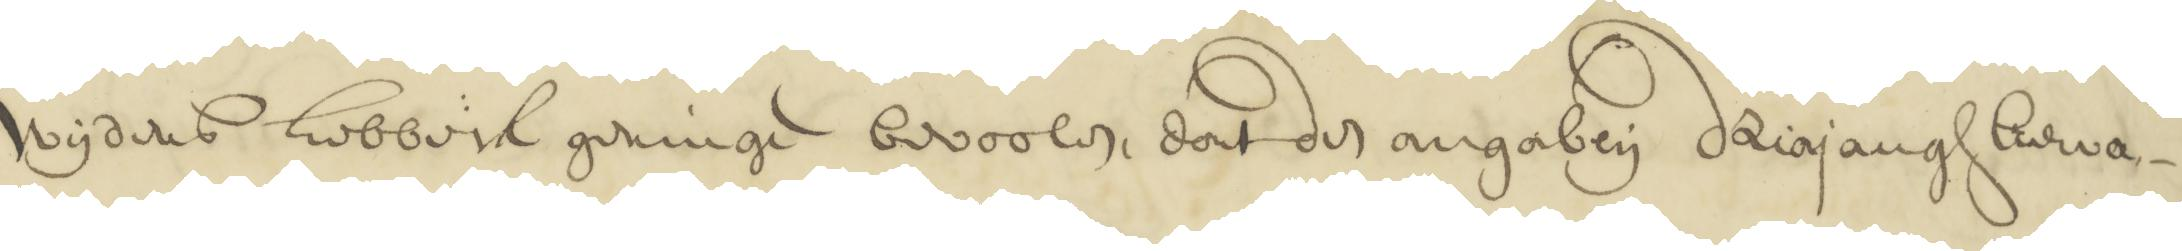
Wijders hebbe ik geringe bevoolen, dat den angabeij dziajangh kewa,-
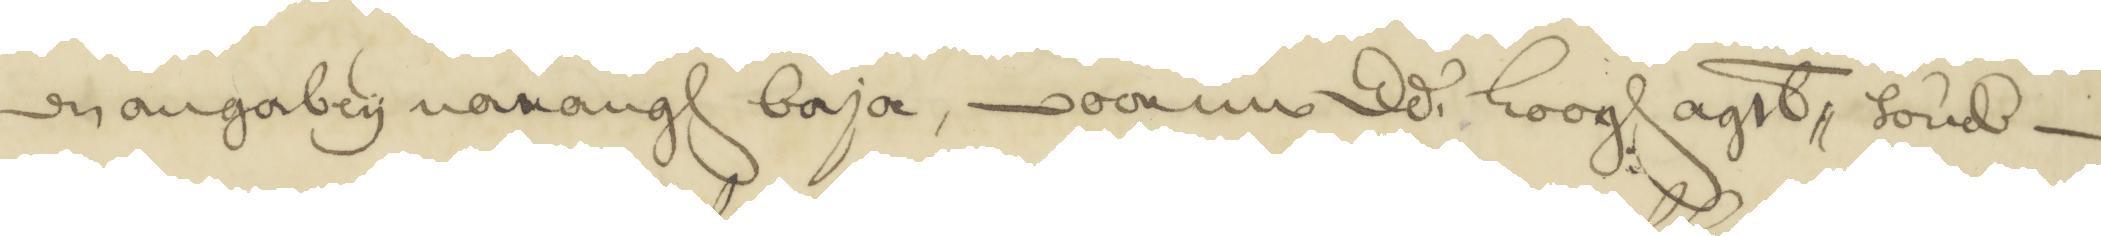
en angabeij narangh baja, voor uw Ed:' hoog: agtb„ soude _
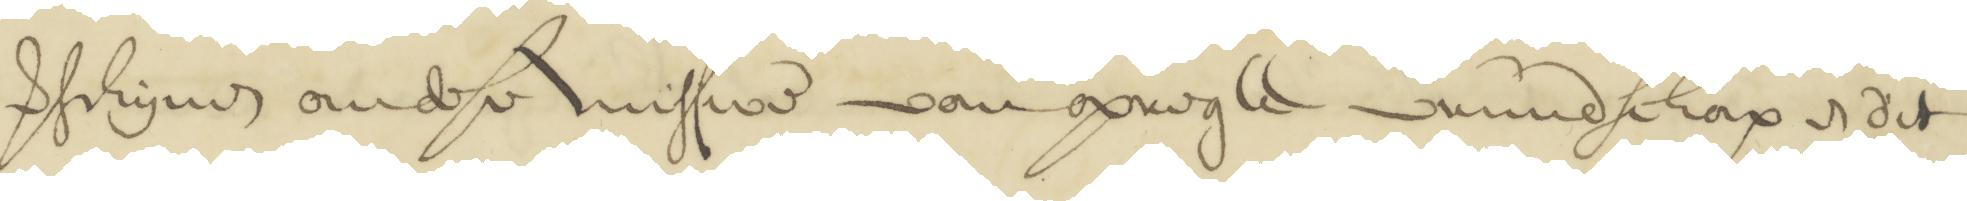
verschijnen om dese missive van opregte vrundschap en dit
